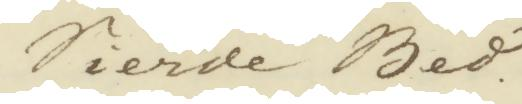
Vierde Bed.
